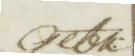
gebr:
